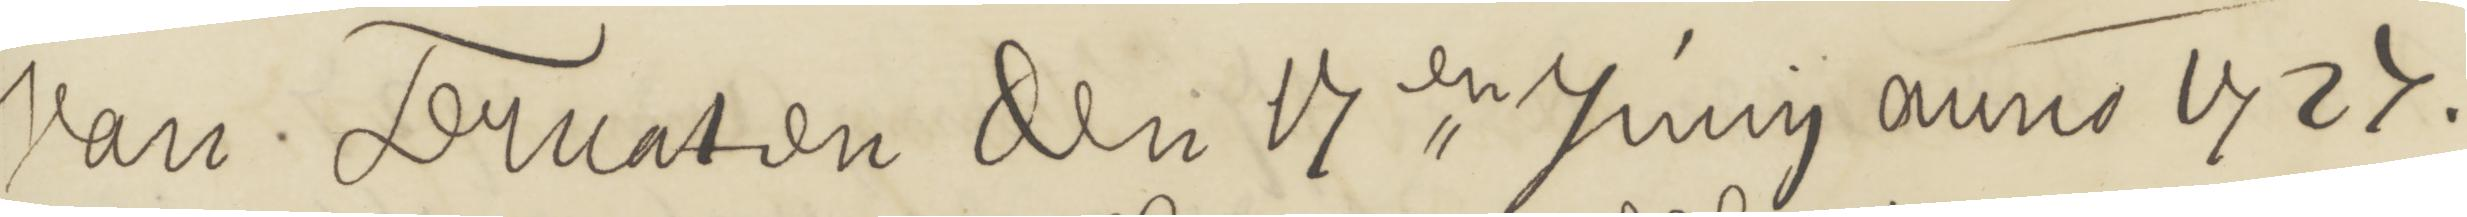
van Ternaten den 17„en Junij anno 1727.
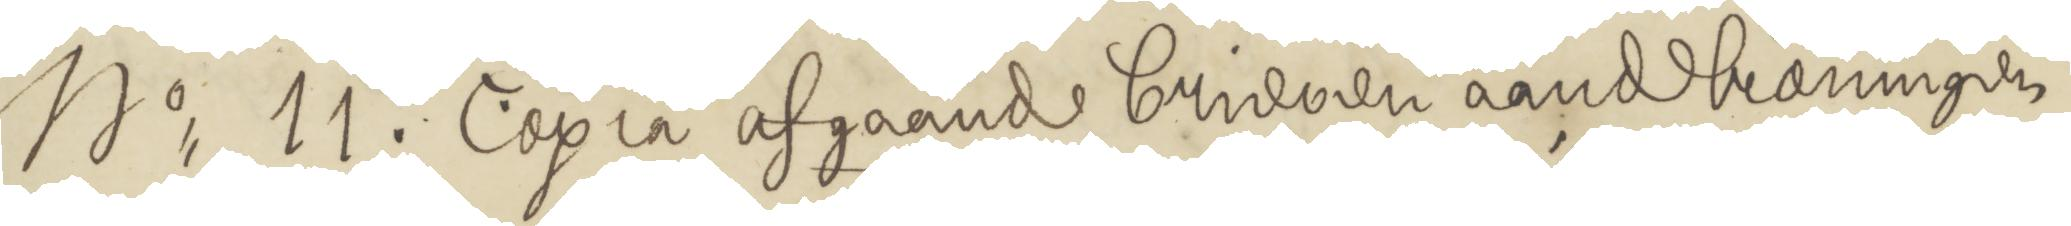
N„o 11. Copia afgaande brieven aande koningen
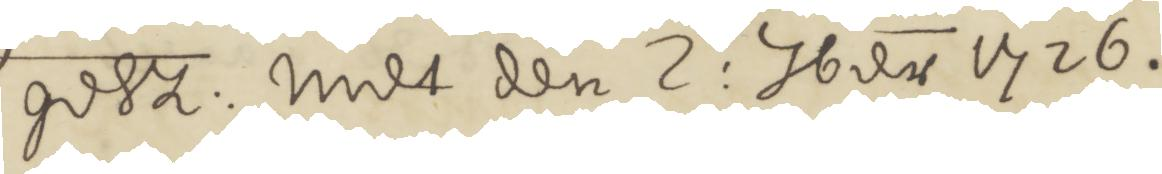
gesz: met den 2:' 7ber 1726.
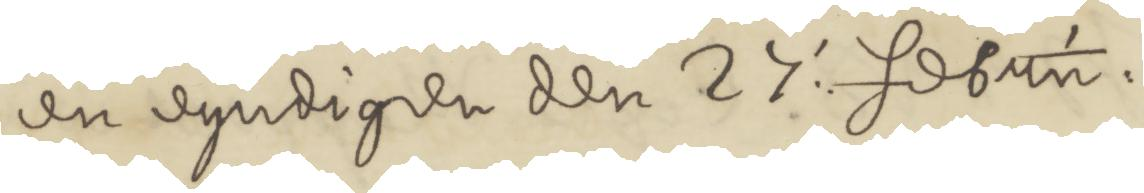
en eijndigen den 27:' febru:i
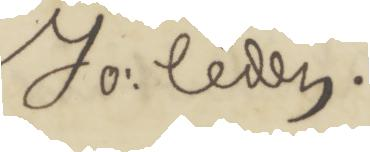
Io: leden.
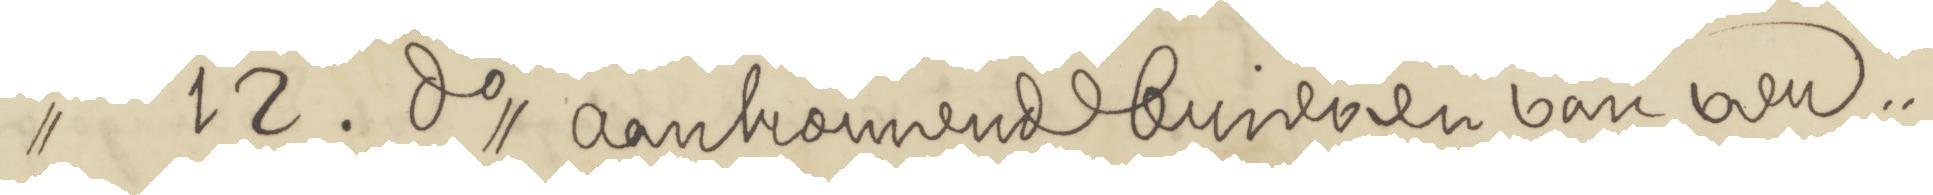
„ 12. d„o aankomende brieven van ver„
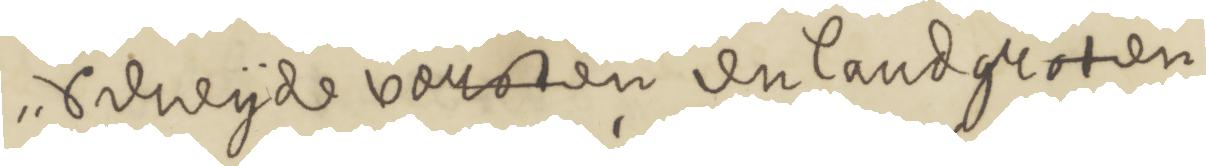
„scheijde vorsten en landgroten
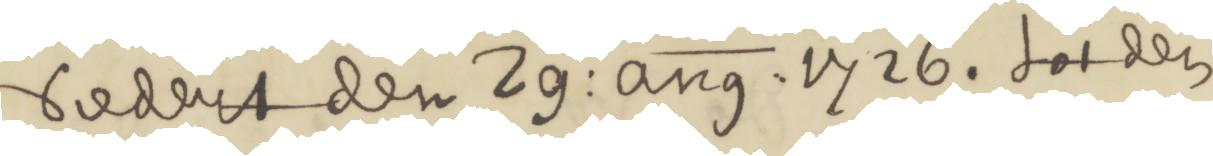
sedert den 29:' aug: 1726. tot den
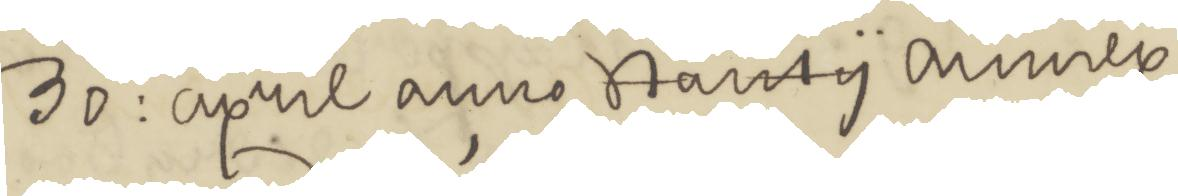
30:' april anno stantij annex
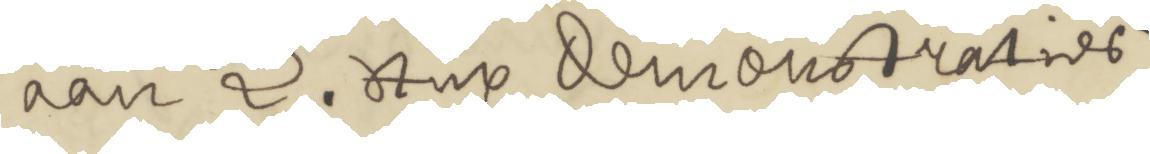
aan 2. stux demonstraties
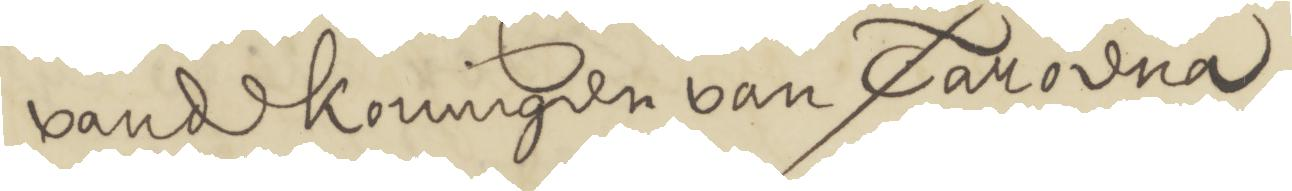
van de koningen van Taroena
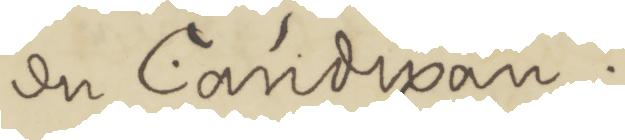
en Caudipan.
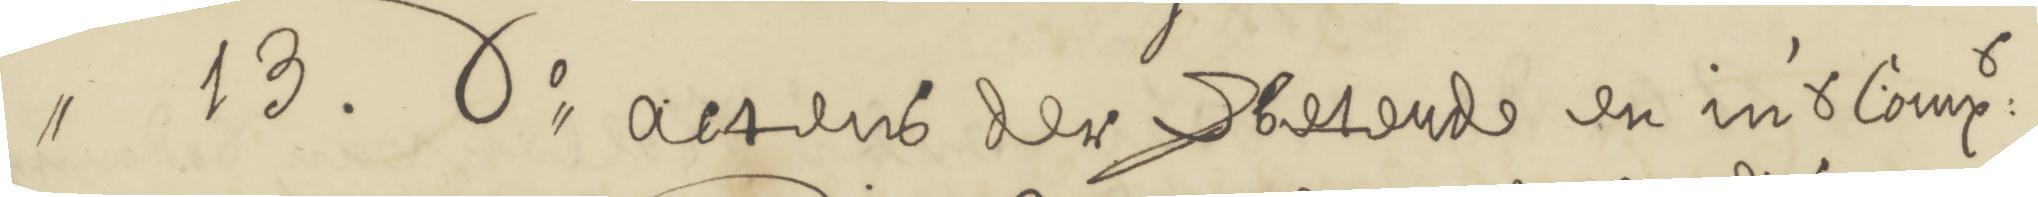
„ 13. d„o actens der verbeterde en in ’s Comp:s
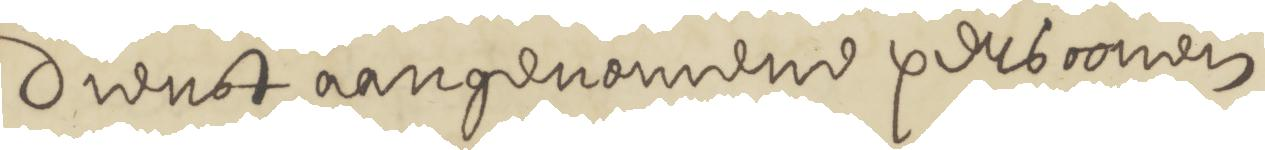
dienst aangenomene persoonen
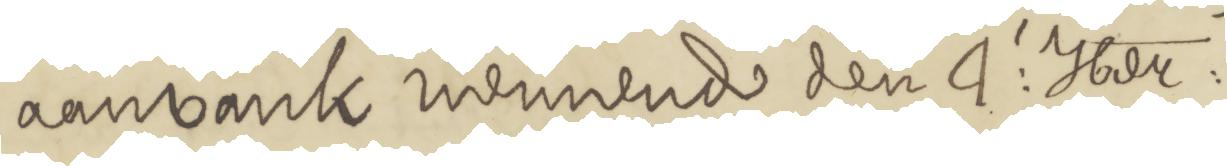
aanvank nemende den 4:' 7ber:
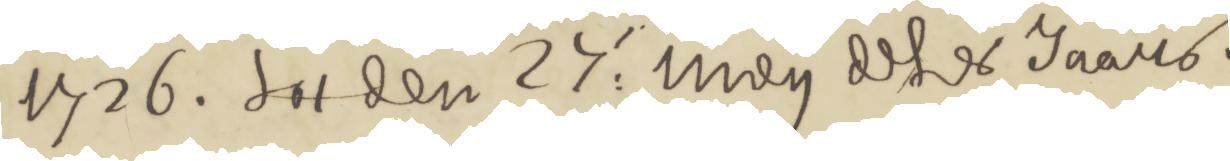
1726. tot den 27:' Meij deses Iaars.
